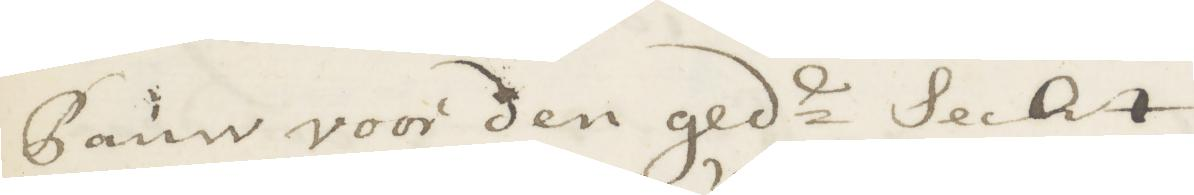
Pauw voor den ged=e secht
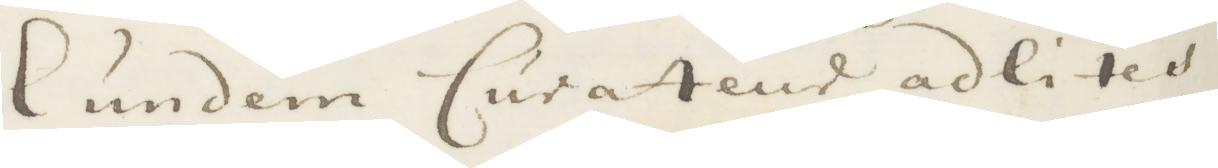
Eundem Curateur ad lites
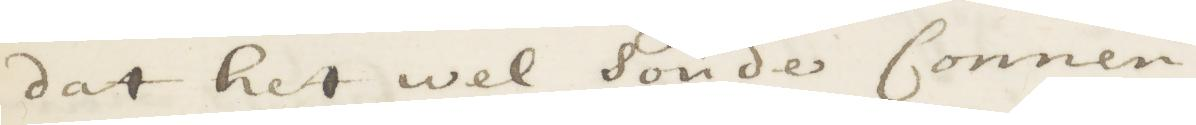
dat het wel soude Connen
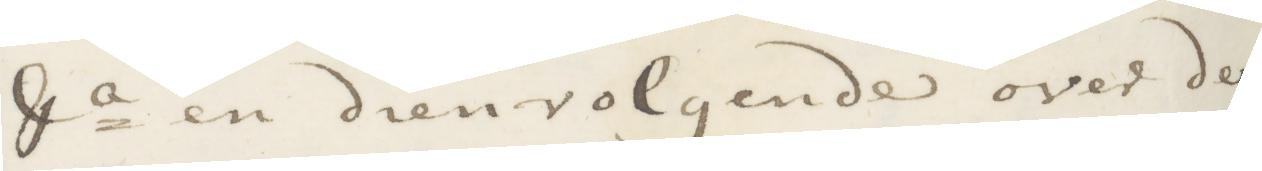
&=a en dienvolgende over de
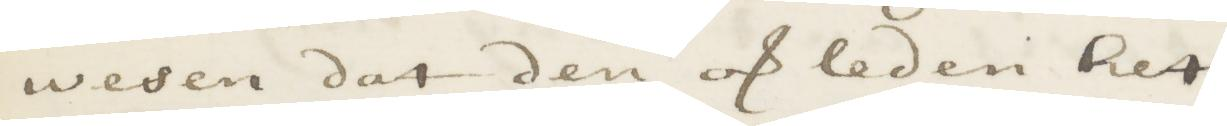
wesen dat den over leden het
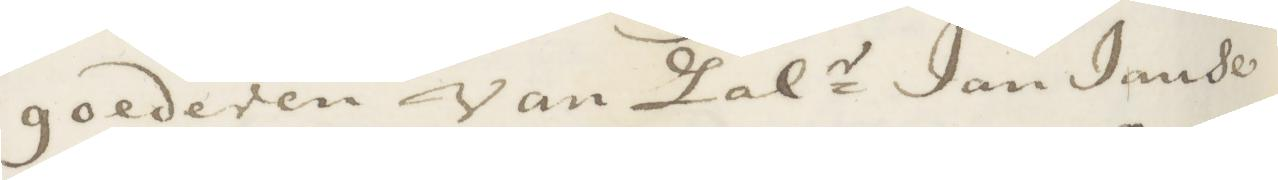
goederen van Zal=r Ian Ianse
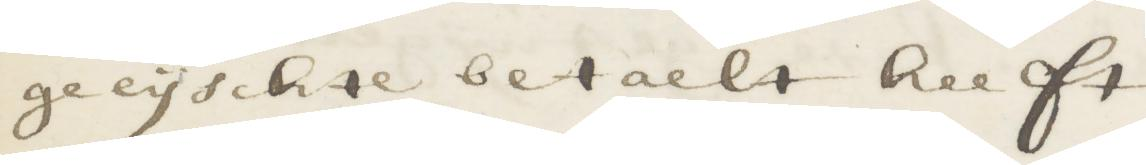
geeijschte betaelt heeft
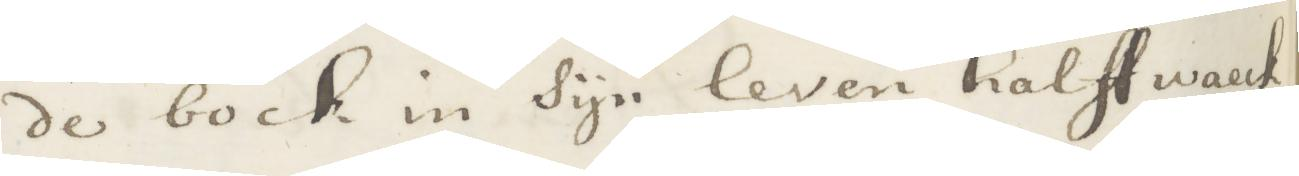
de bock in sijn leven halff waeck
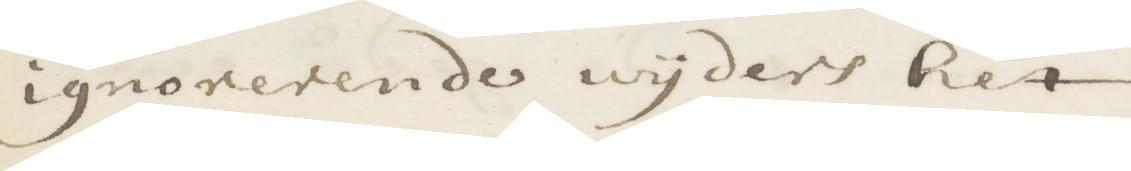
ignorerende wijders het
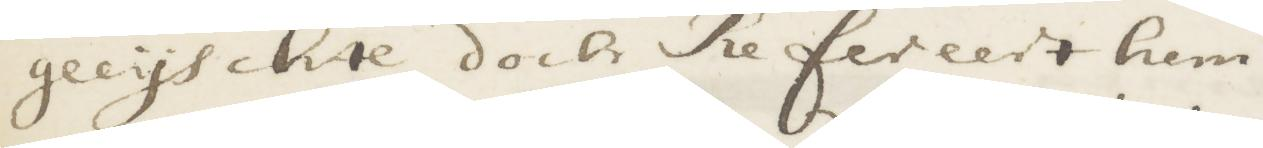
geeijschte doch Refereert hem
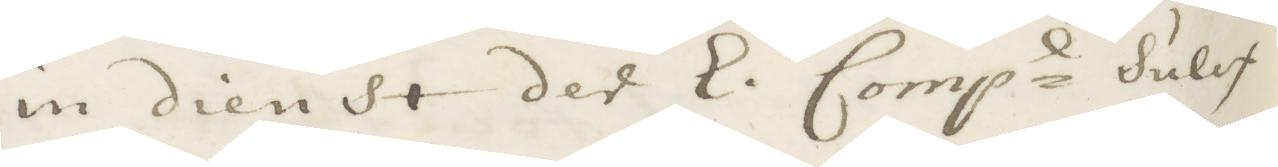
in dienst der E. Comp=e sulcx
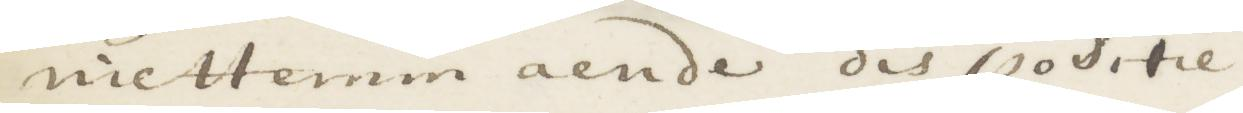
niettemin aende dis positie
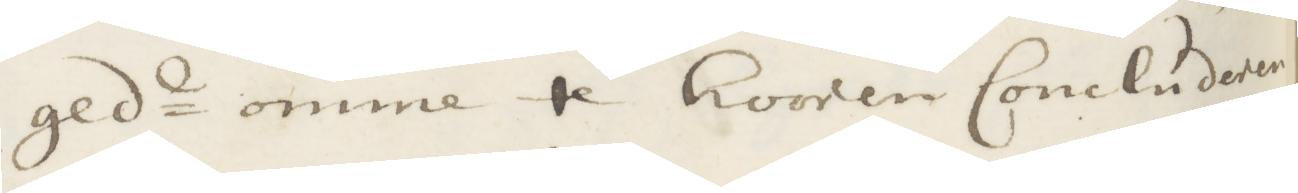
ged=e omme te hooren Concluderen
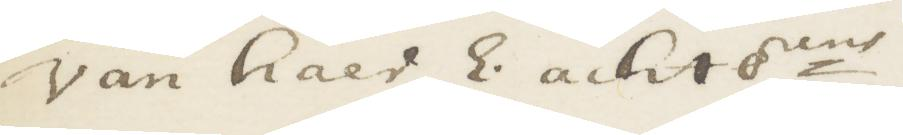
van haer E achtb=ren
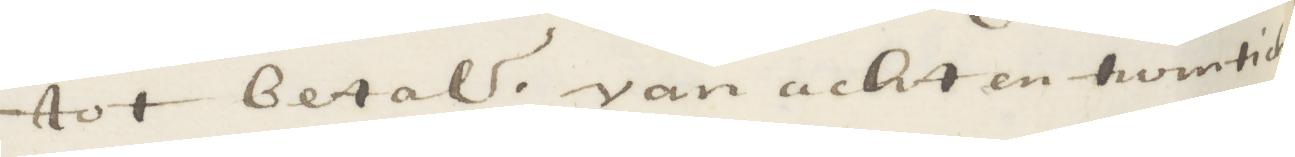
tot betal.e van acht en twintich
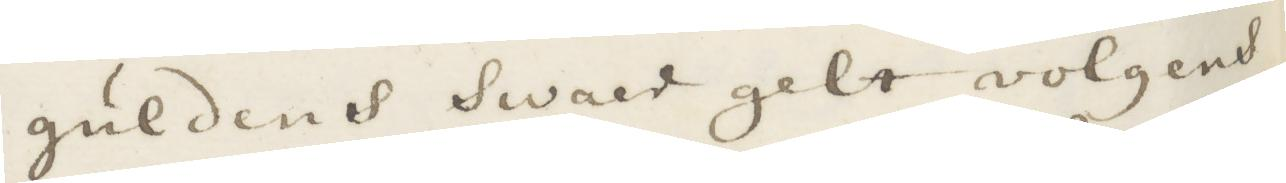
guldens swaer gelt volgens
